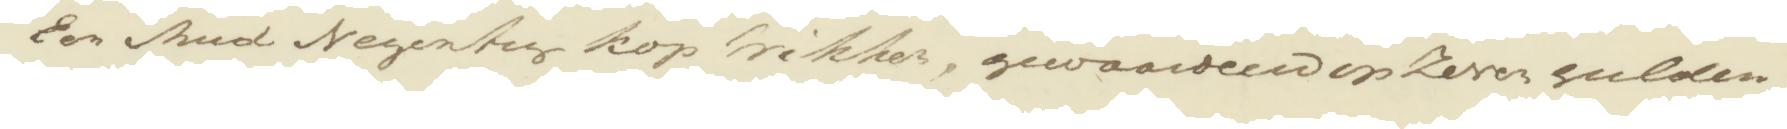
Een Mud Negentig kop wikken, gewaardeerd op Zeven gulden
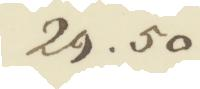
29. 50
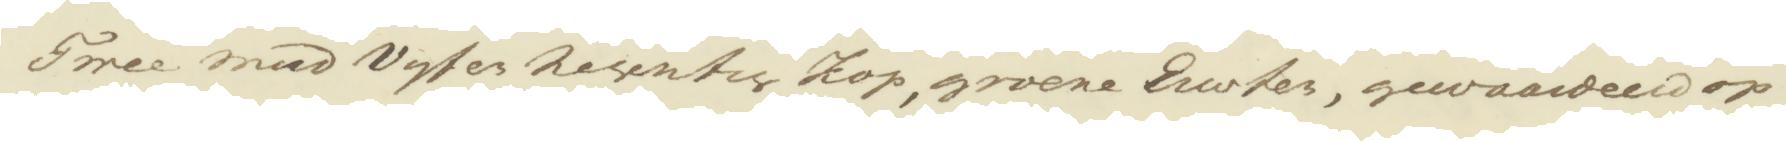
Twee mud vyf en negentig Kop, groene Erwten, gewaardeerd op
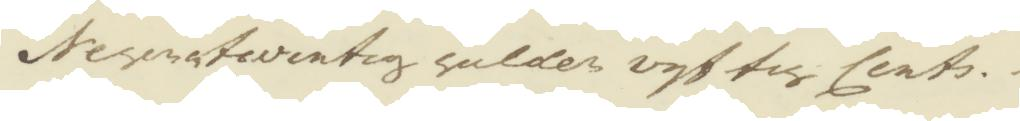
Negenentwintig gulden vyftig Cents.
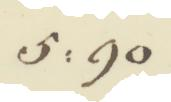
5: 90
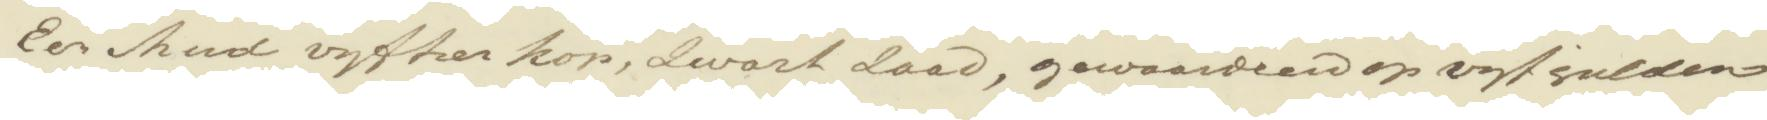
Een Mud vyftien kop, zwart zaad, gewaardeerd op vyf gulden
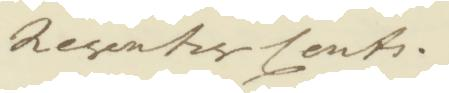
negentig Cents.
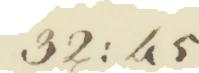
32: 45
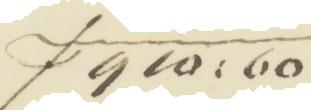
ƒ 910: 60
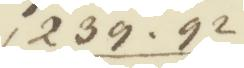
239. 92
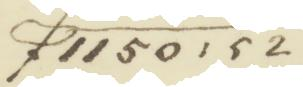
ƒ1150:52
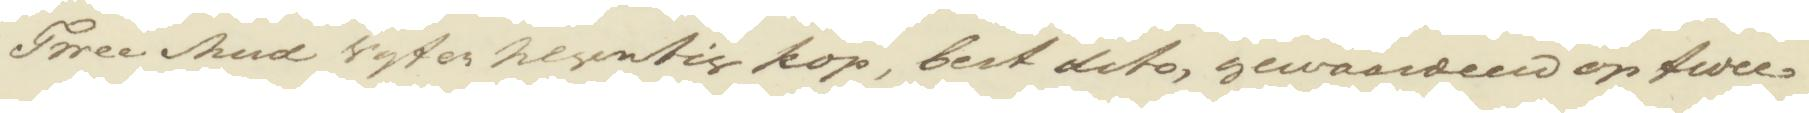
Twee Mud Vyfen negentig kop, best dito, gewaardeerd op twee
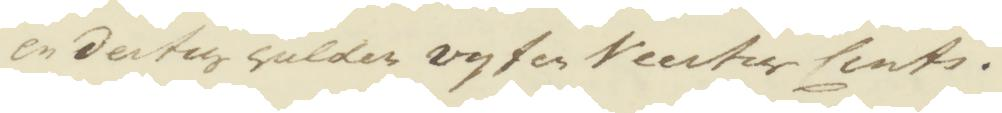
en dertig gulden vyfen Veertig Cents.
